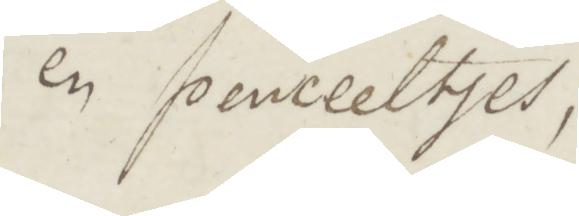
en penceeltjes,
